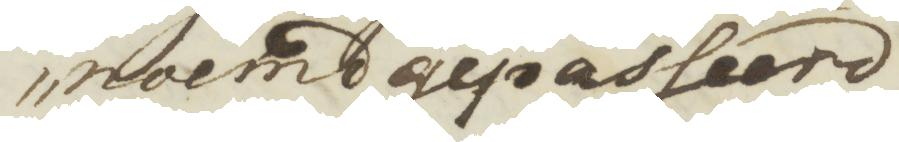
„noemd gepasseerd
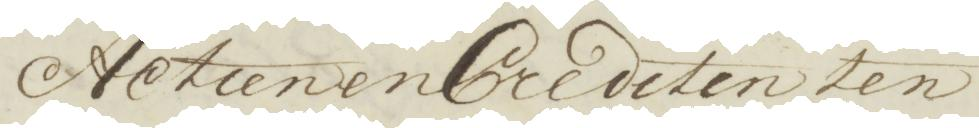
Actien en Crediten ten
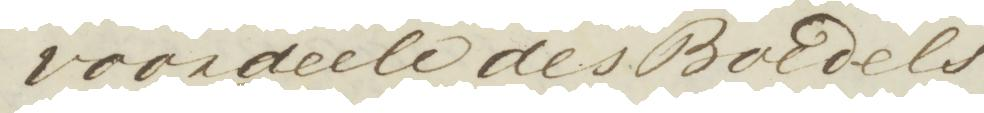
voordeele des Boedels
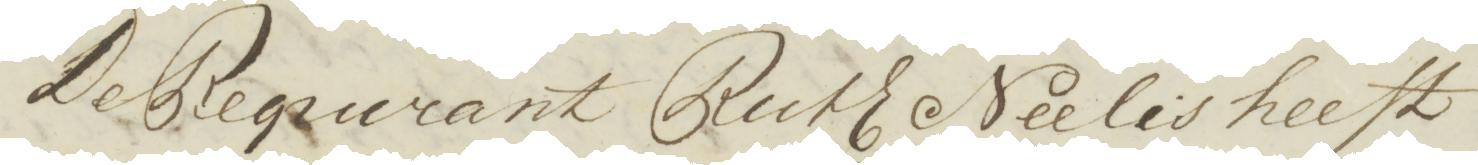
De Requirant Ruth Neelis heeft
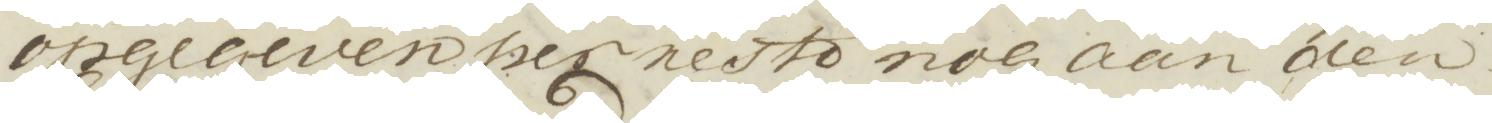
opgegeven per resto nog aan den
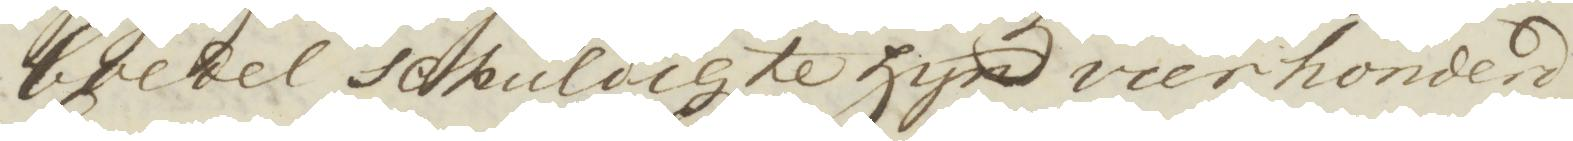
boedel schuldig te zijn vierhonderd
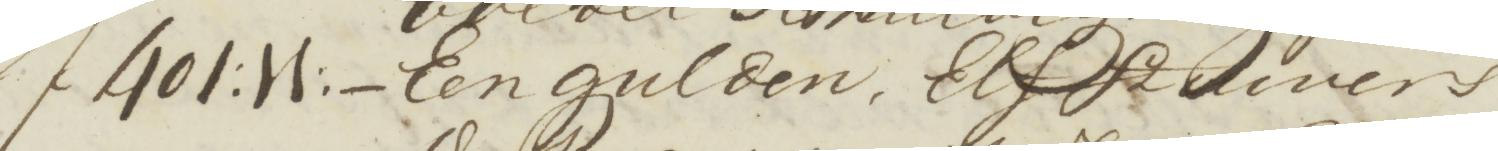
ƒ401:11:— Een gulden, Elf Stuivers
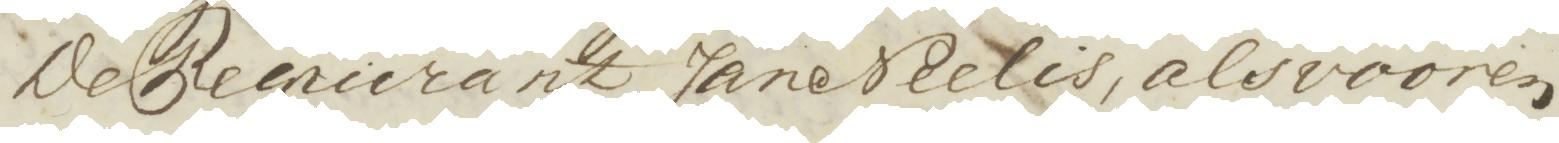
De Requirant Jan Neelis, als vooren
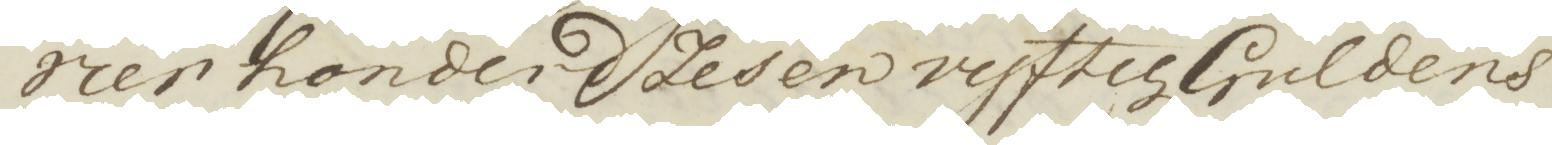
vier honderd zes en vyftig Guldens
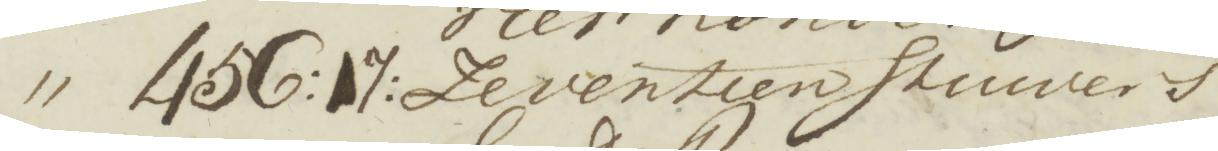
„ 456:17: zeventien Stuivers
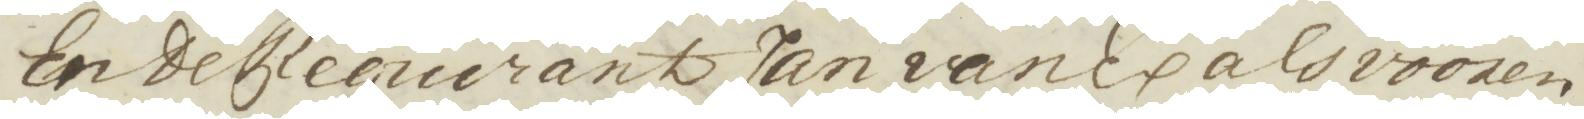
En de Requirant Jan van Ex als vooren
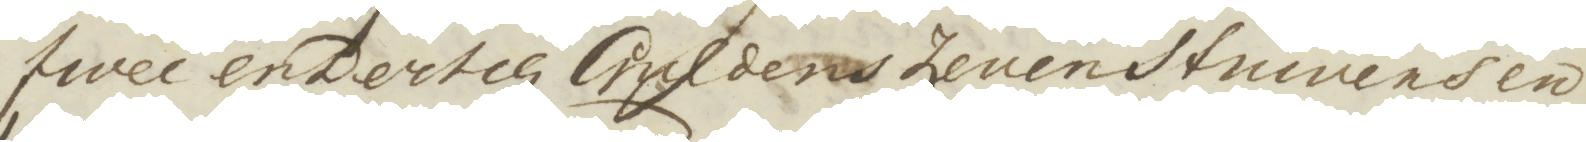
twee en Dertig Guldens Zeven stuivers en
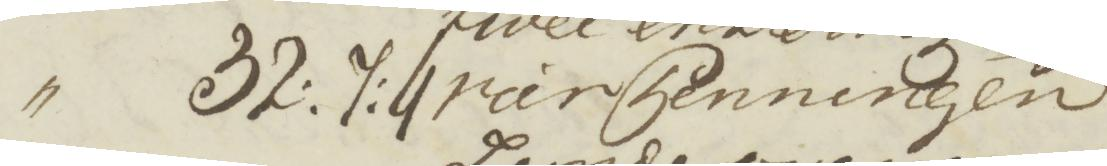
„ 32: 7:4 vier Penningen
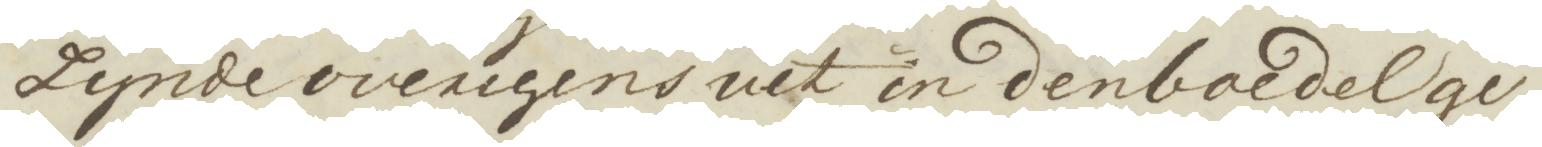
zynde overigens uit in den boedel ge
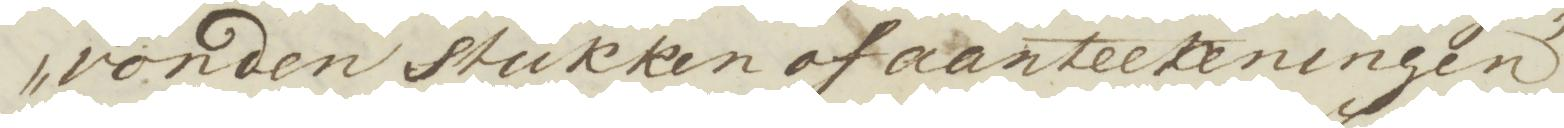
„vonden stukken of aanteekeningen
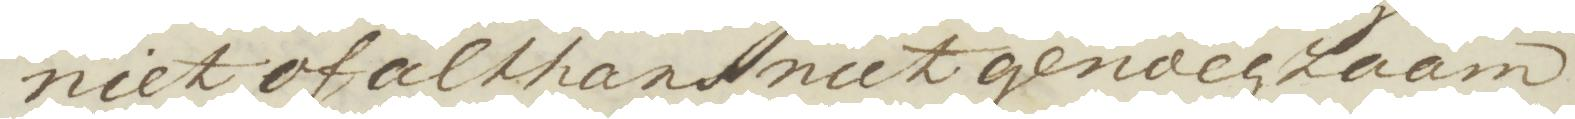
niet of althans niet genoegzaam
